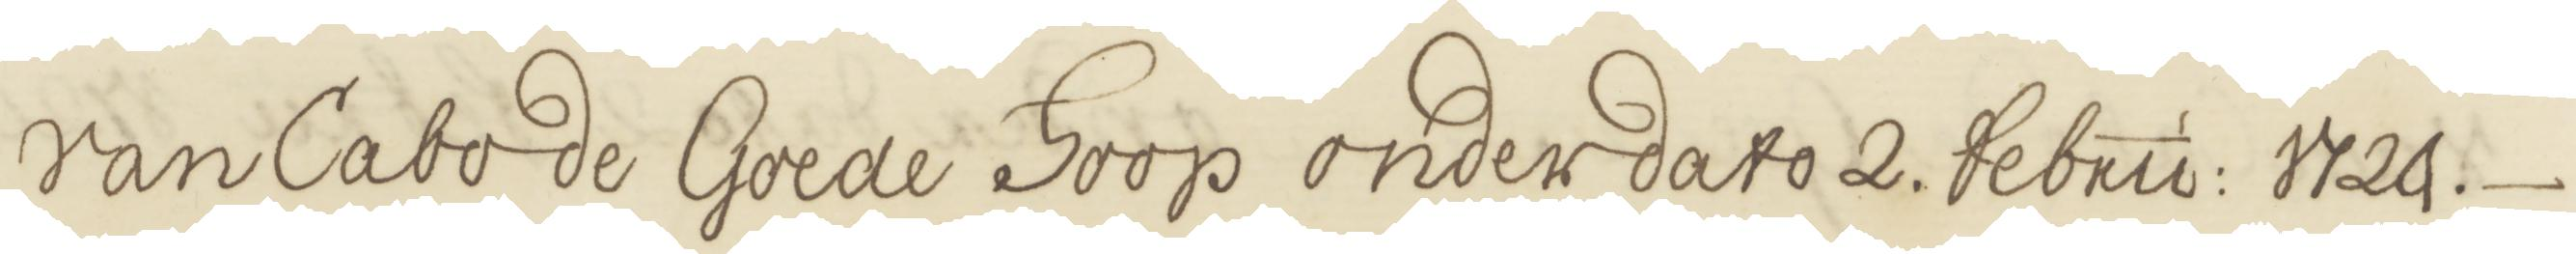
van Cabo de Goede Hoop onder dato 2. febru: 1724. —
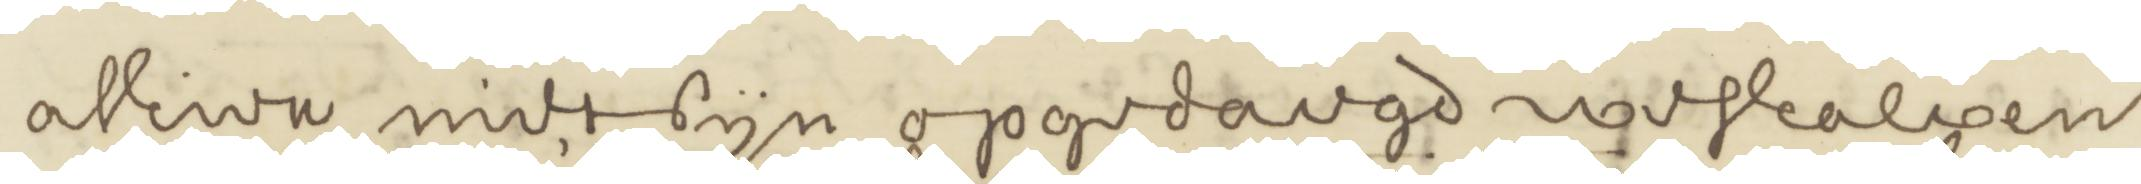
alhier niet sijn opgedaegd weshalven
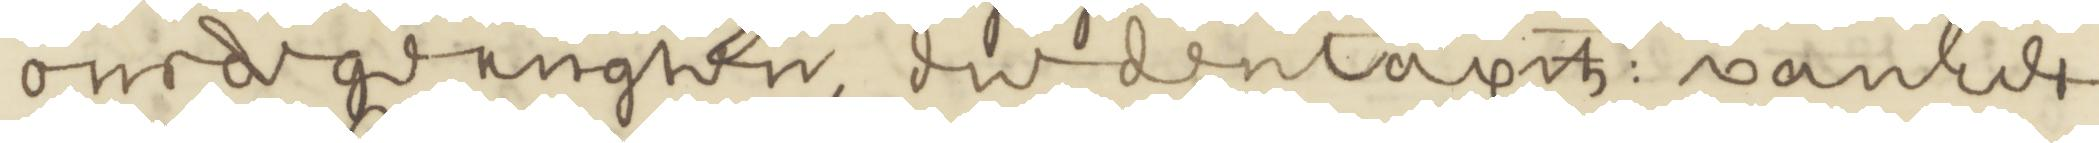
ons de gerugten, die den Capit: van het
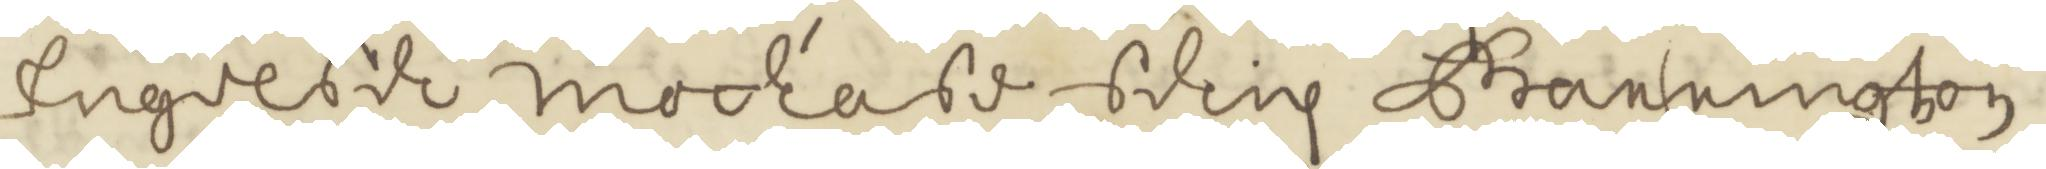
Engelsch mochase schip Barrington
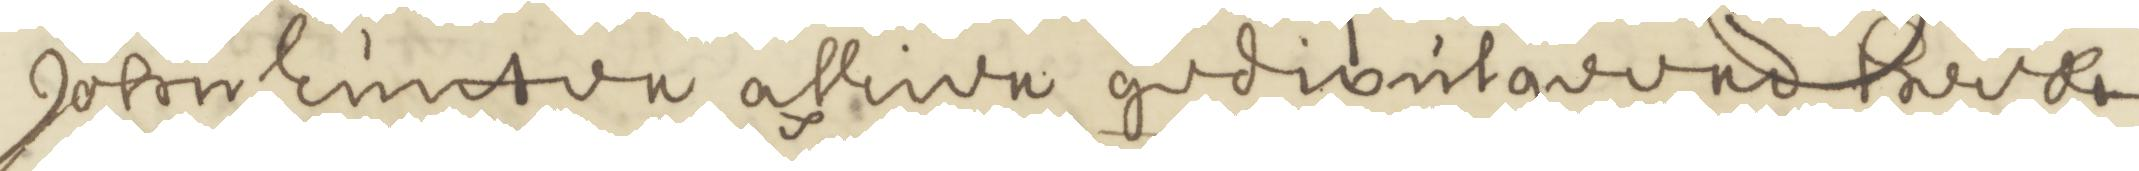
John hunter alhier gedivulgeerd heeft
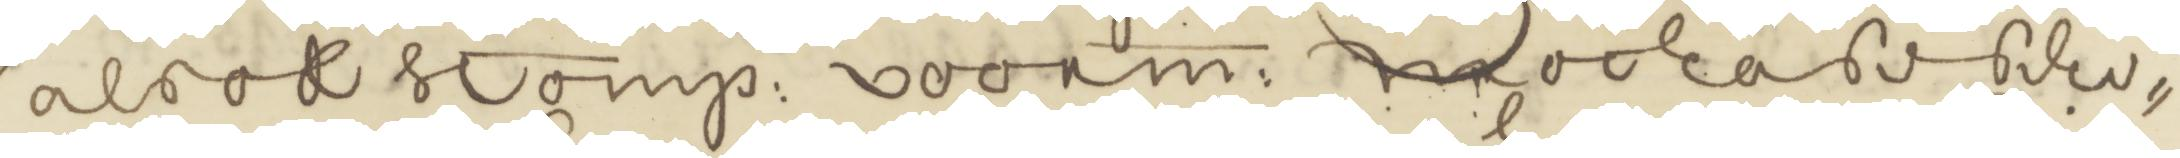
als of sComp:s voorm: mochase sche„
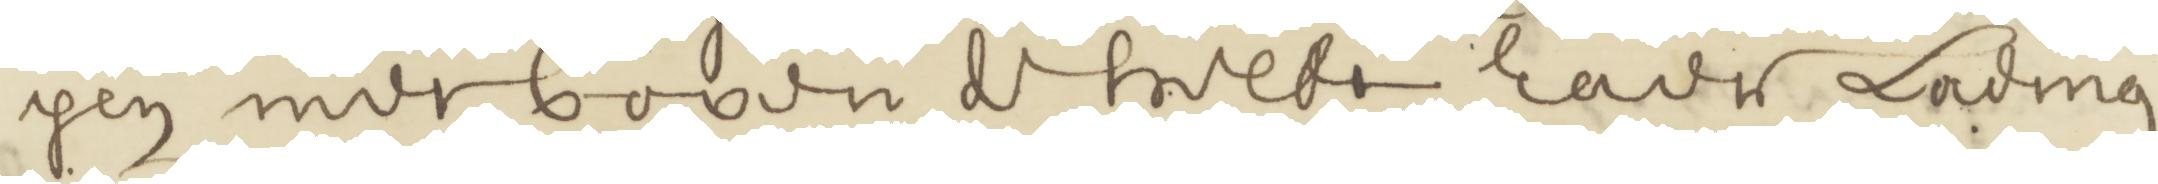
pen niet boven de helft haer lading
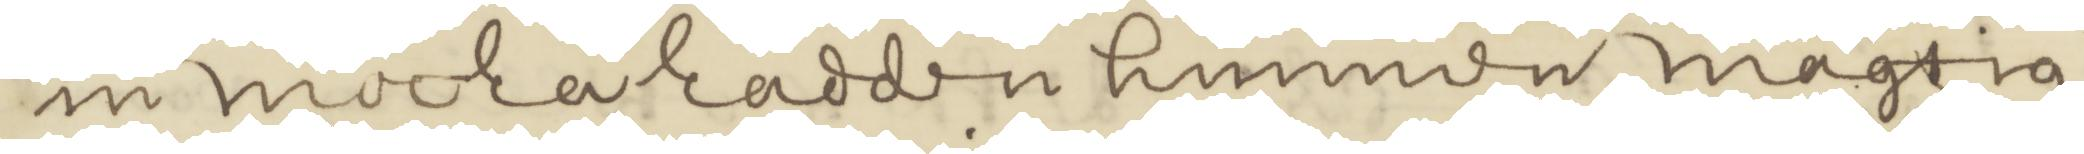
in mocha hadden kunnen magtig
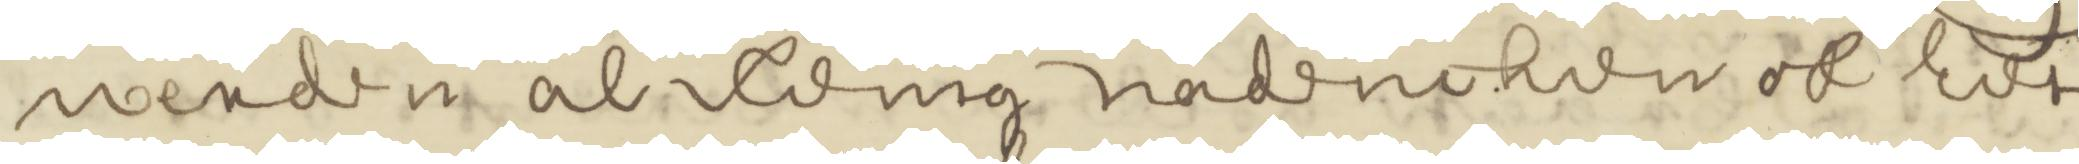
werden al Eenig nadencken of het
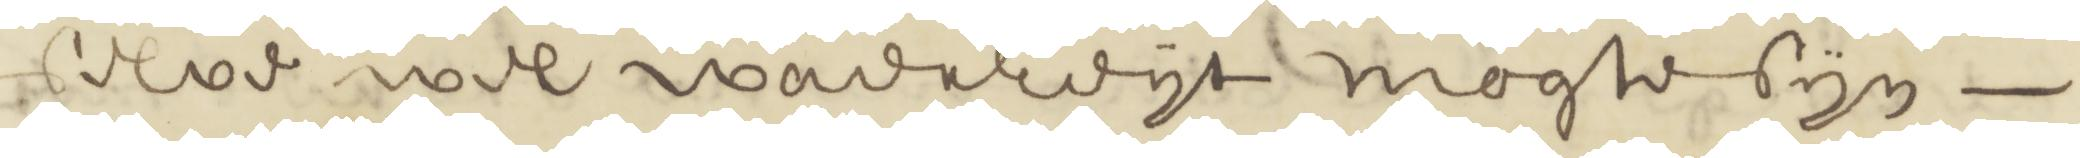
selve wel waerheijt mogte sijn —
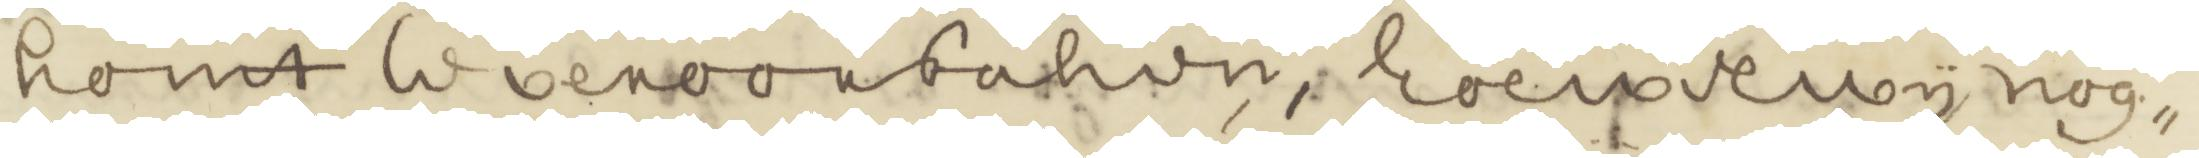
komt te veroorsaken, hoewel wij nog„
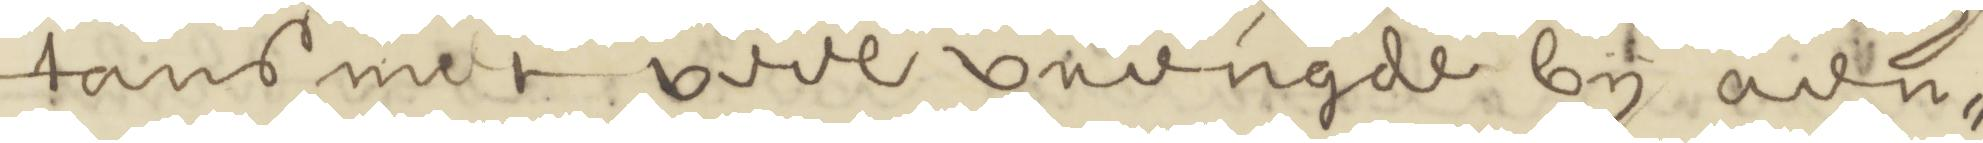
tans met veel vreugde bij aen„
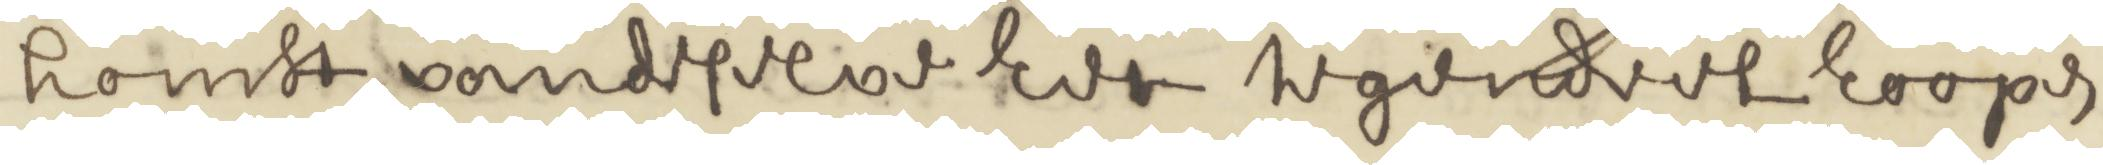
komst van deselve het tegendeel hoopen
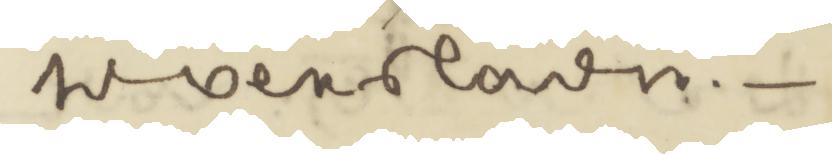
te verstaen. —
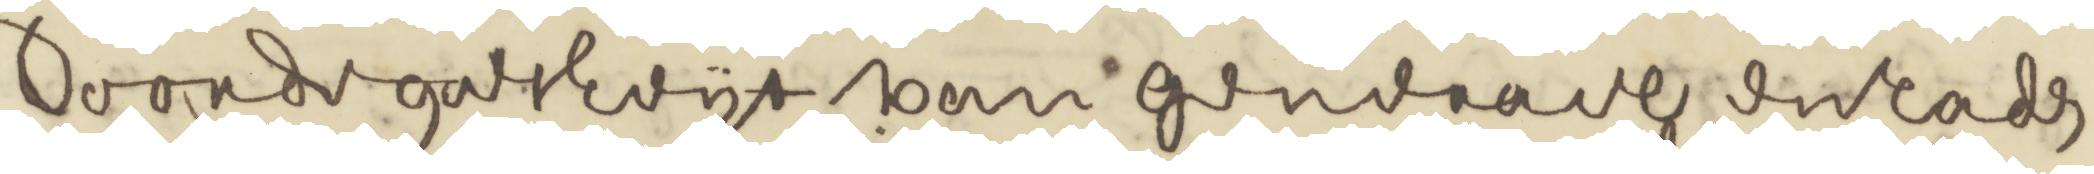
door de goetheijt van generael en raden
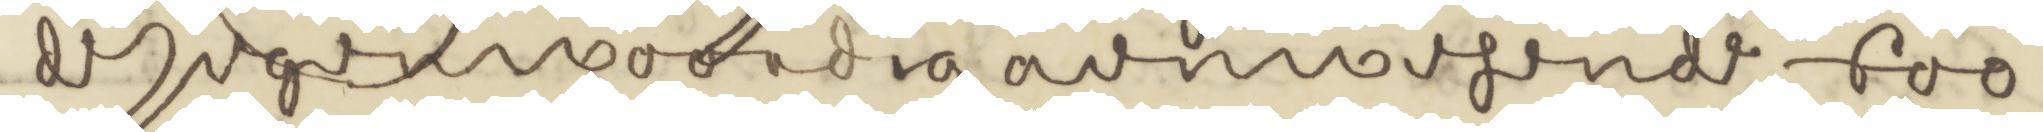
de Jegenwoordig aenwesende soo
